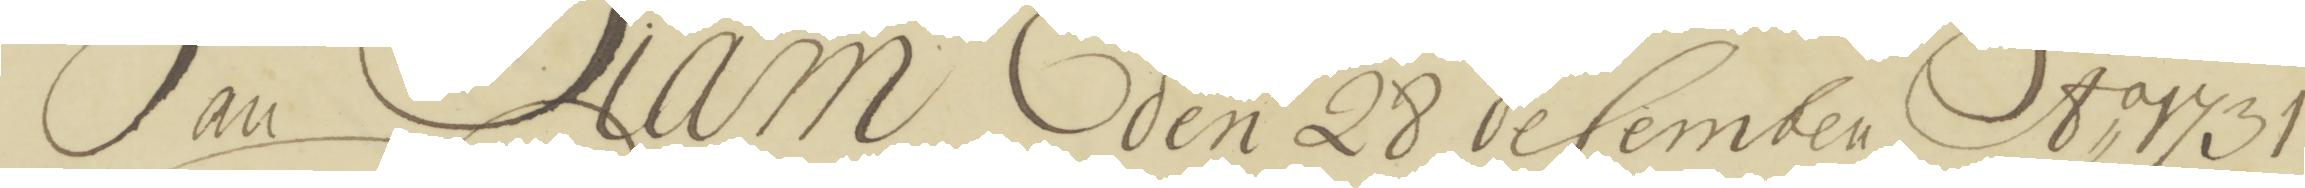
Van Siam den 28 december A„o 1731
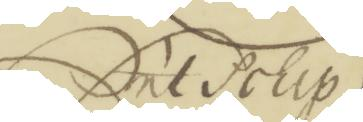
In't schip
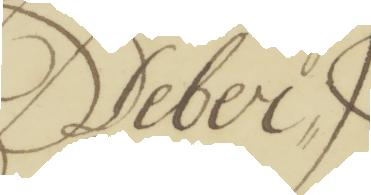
Deber
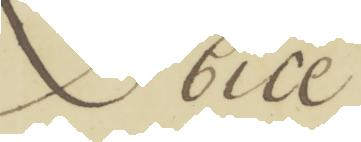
bice
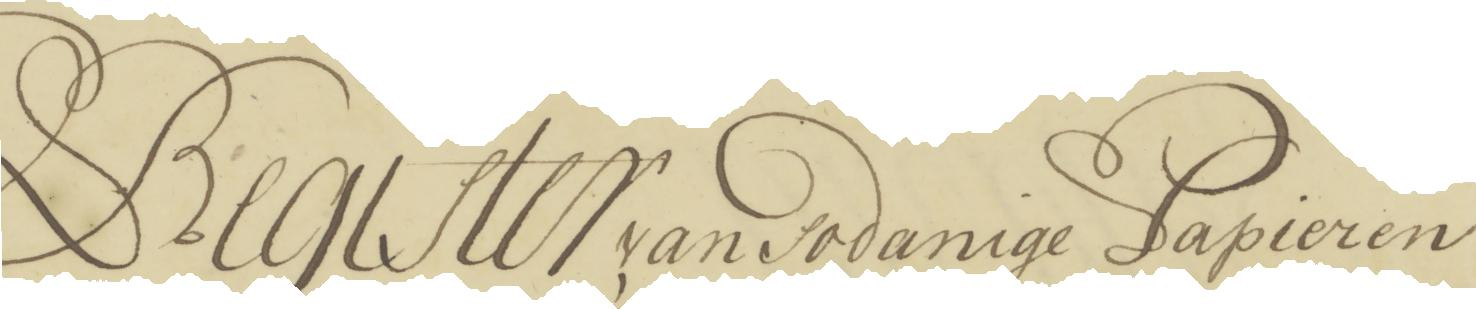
Register van sodanige Papieren
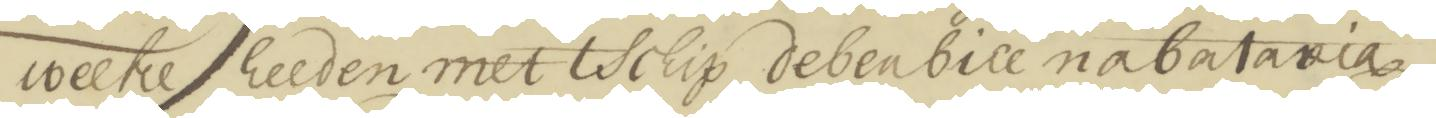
welke heeden met ’tschip de berbice na batavia
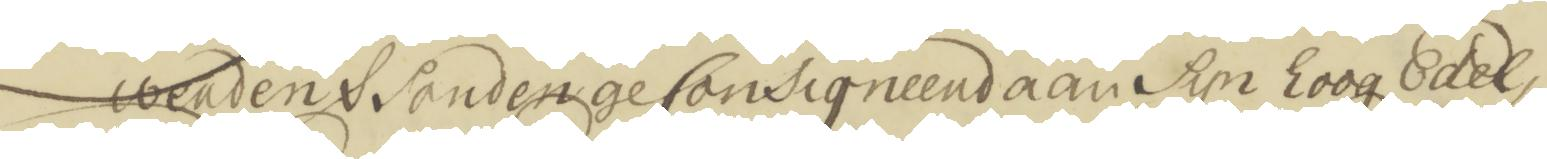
werden ver sonden geconsigneerd aan Syn hoog Edel„
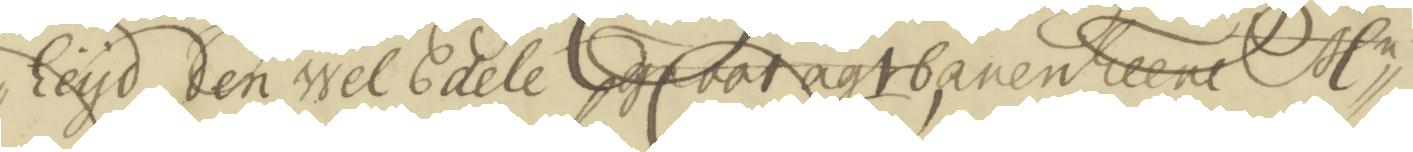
heijd den wel Edele groot agtbaren heere M:r
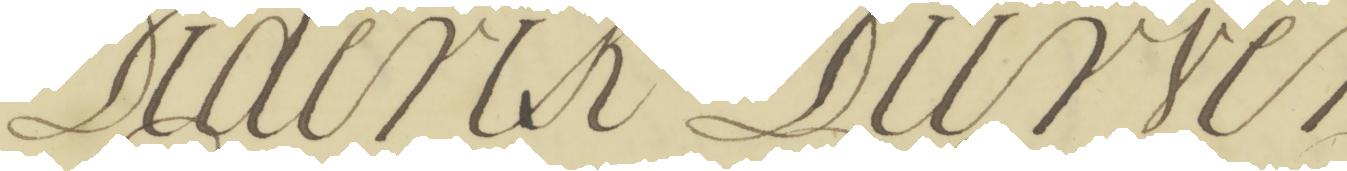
Diderik Durve
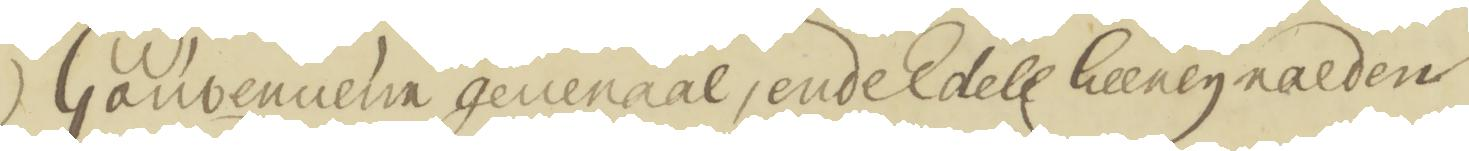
Gouverneur generaal, ende Edele heeren raeden
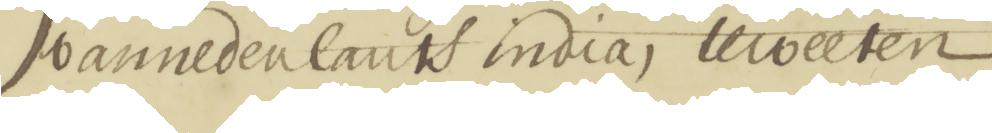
van nederlants india, teweeten
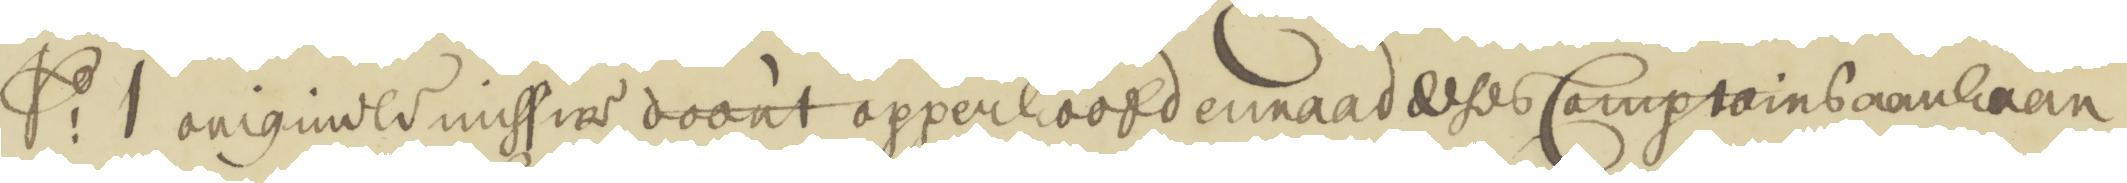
N:o 1 originele missive door't opperhoofd en raad deses Comptoirs aan haar
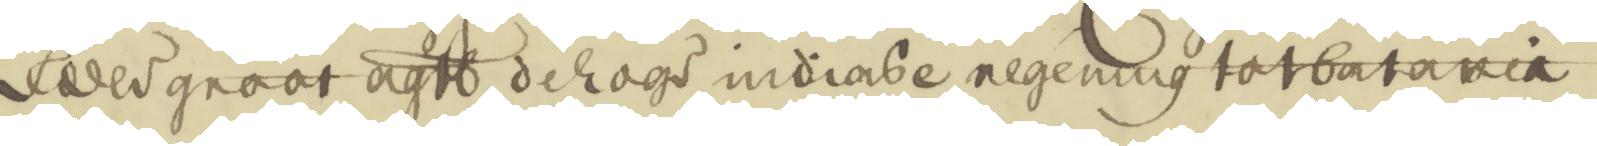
Edele groot agtb: de hoge indiase regening tot batavia
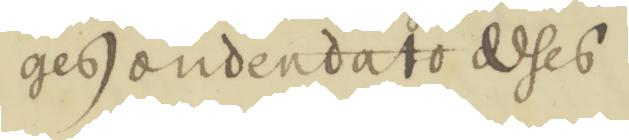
gesonden dato deses
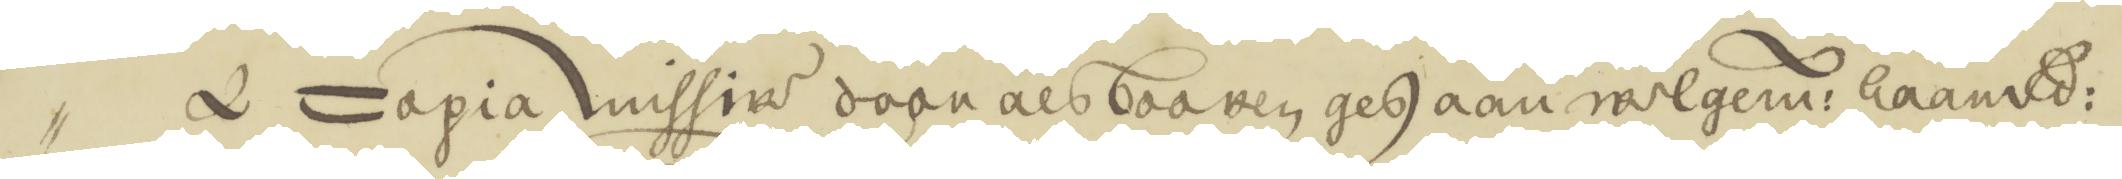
„ 2 Copia missive door als booven gest aan welgem: haar Ed:
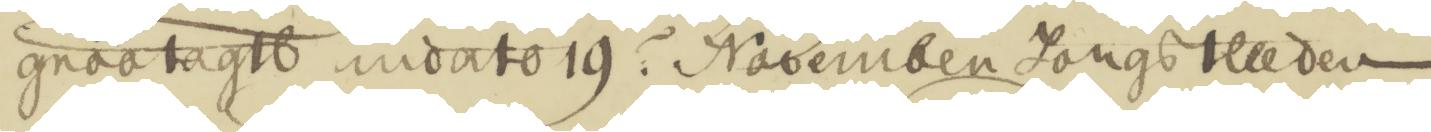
groot agtb in dato 19:' November Iongstleeden
